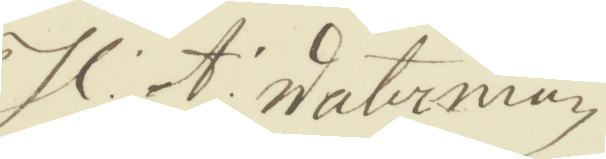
H: A: Waterman
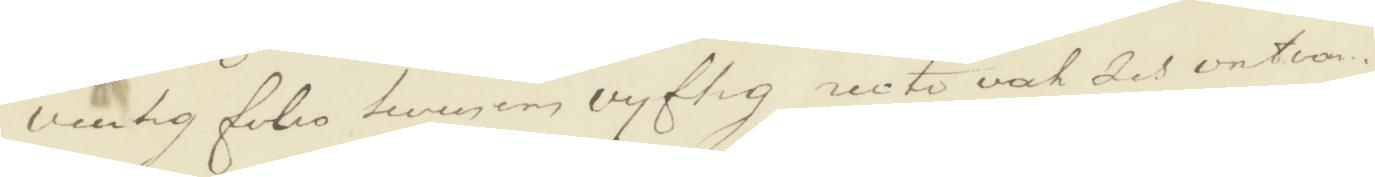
veertig folio twee en vyftig recto vak zes ontvan.
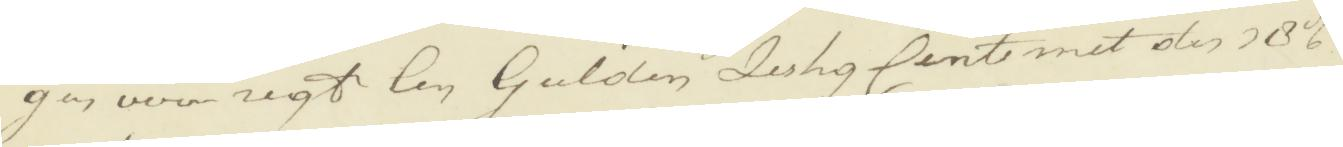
gen voor regt Een Gulden Zestig Cents met den 28%
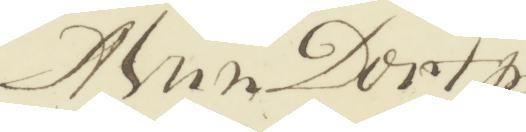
AVan Dort jr
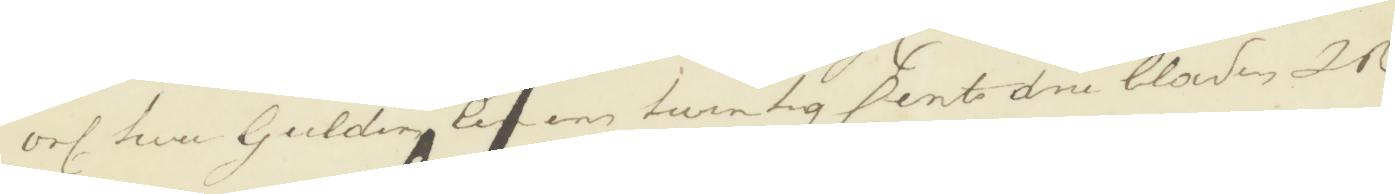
onC twee Guldens Een en twintig Cents drie bladen ZR
